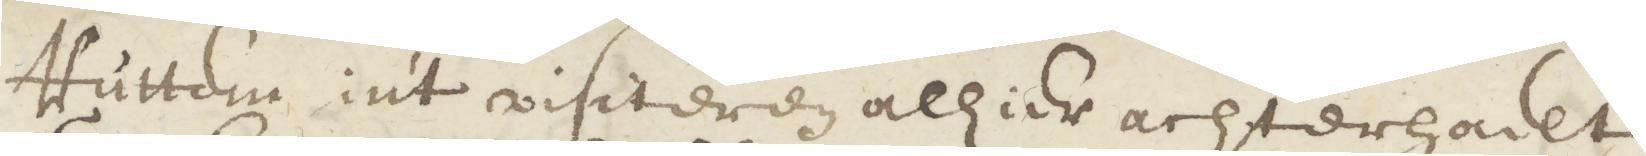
Ruttem in’t visiteren alhier achterhaelt
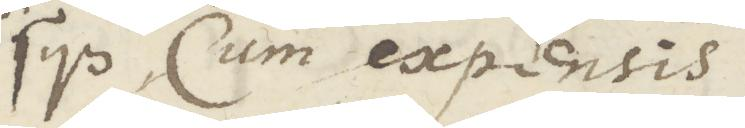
syn, Cum expensis
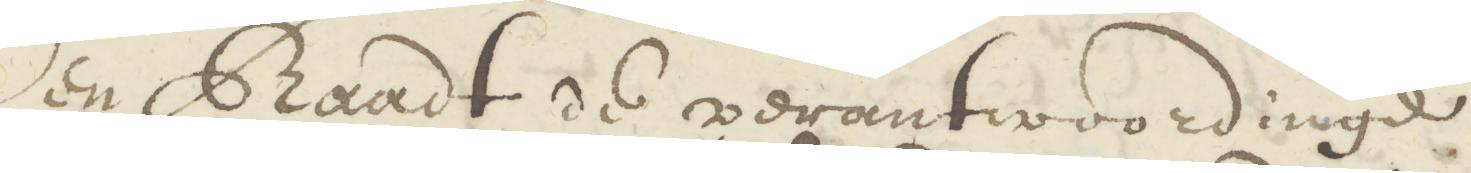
Den Raadt de verantwoordinge
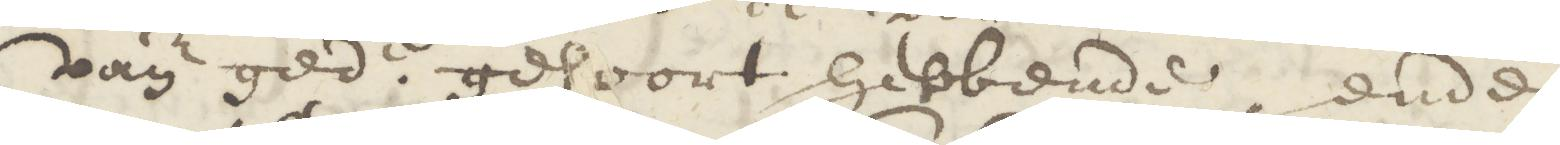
van ged.e gehoort hebbende, ende
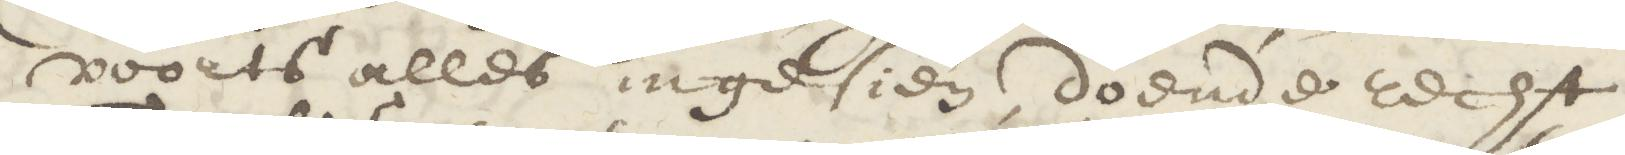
voorts alles ingesien, doende recht,
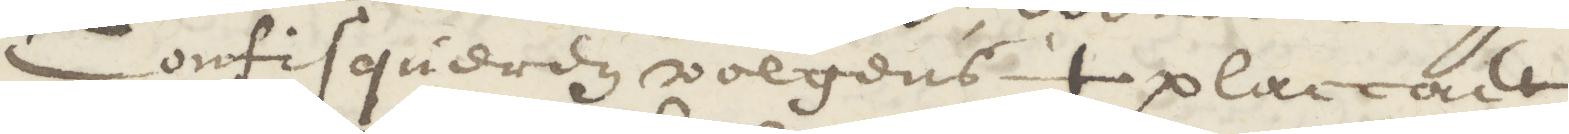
Confisqueren volgens 't placcaet
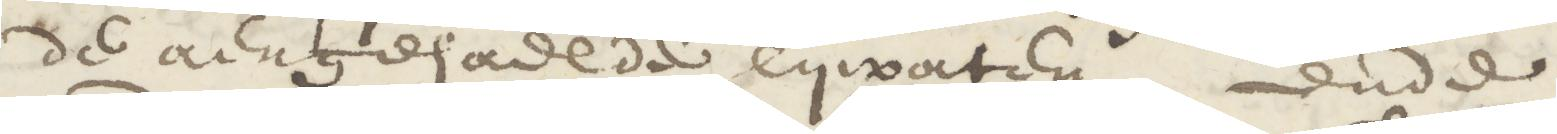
de aengehaelde lywaten, ende
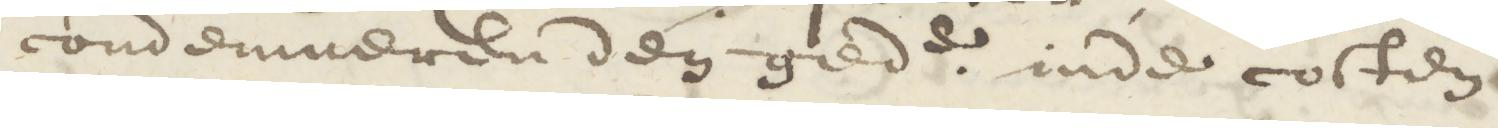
condemneren den ged.e inde costen
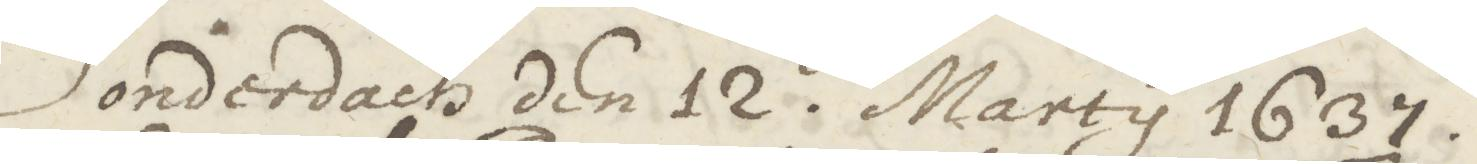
Donderdach den 12.en Martij 1637.
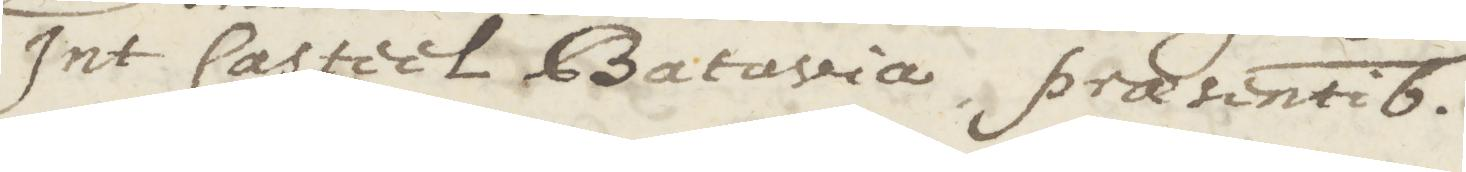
Jnt Casteel Batavia, praesentib.
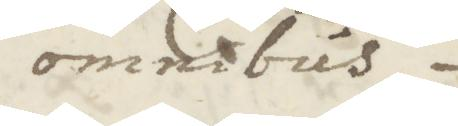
omnibus —
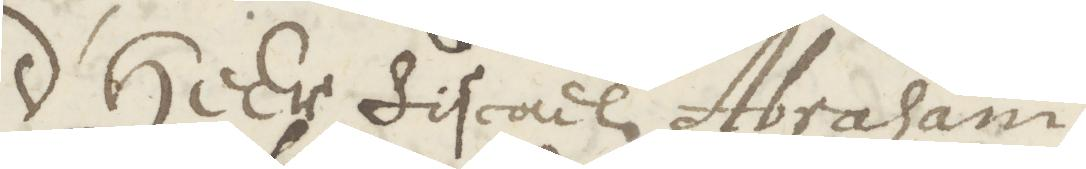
D Heer Fiscael Abraham
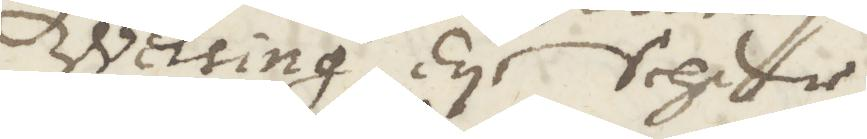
Welsing. Eysscher
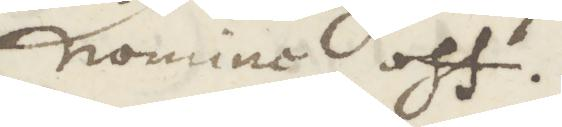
Nomine est.
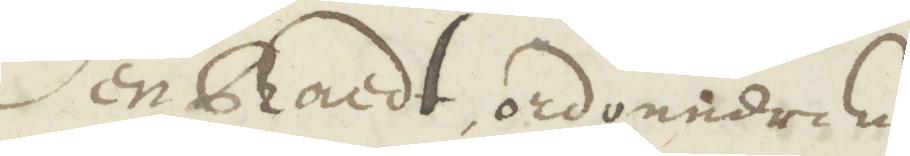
Den Raedt, ordonneren
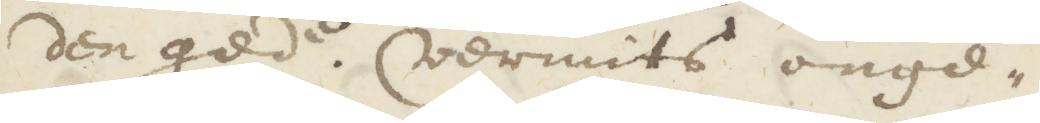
den ged.e vermits onge„
